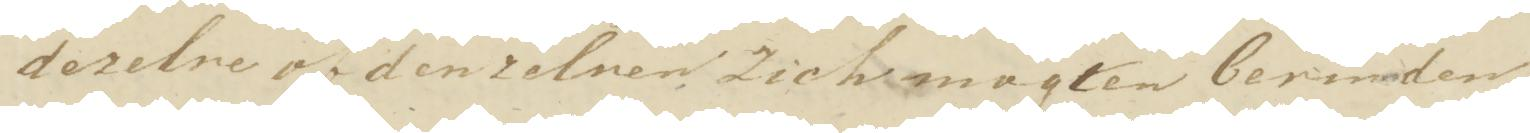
dezelve of den zelven zich mogten bevinden
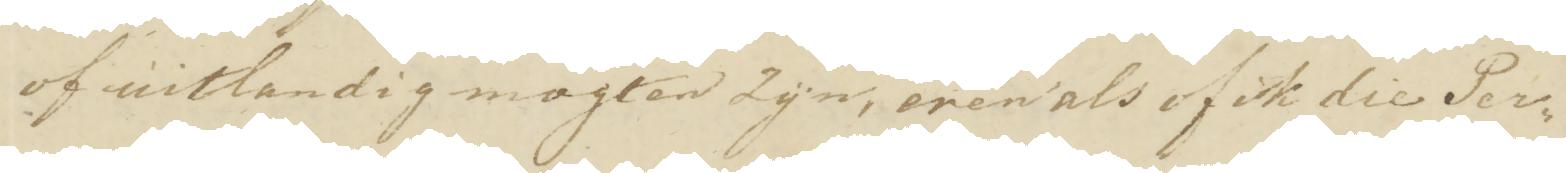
of uitlandig mogten zijn, even als of ik die Per„
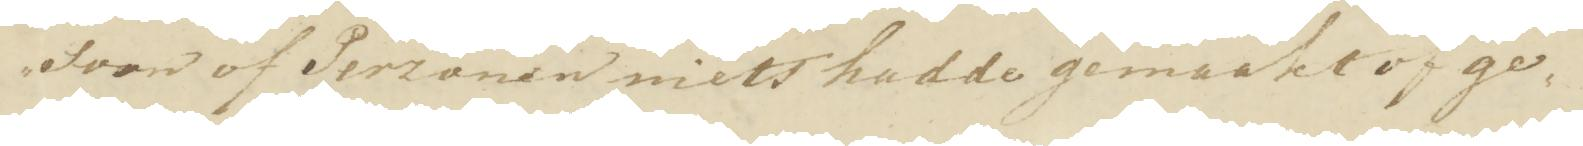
„soon of Perzonen niets hadde gemaakt of ge„
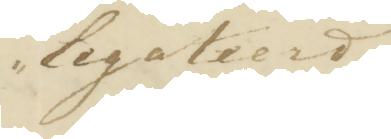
„legateerd
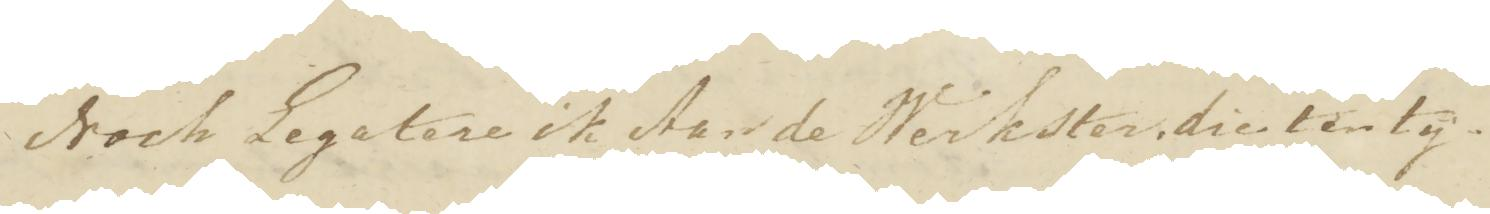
Noch Legatere ik Aan de Werkster, die ten tij„
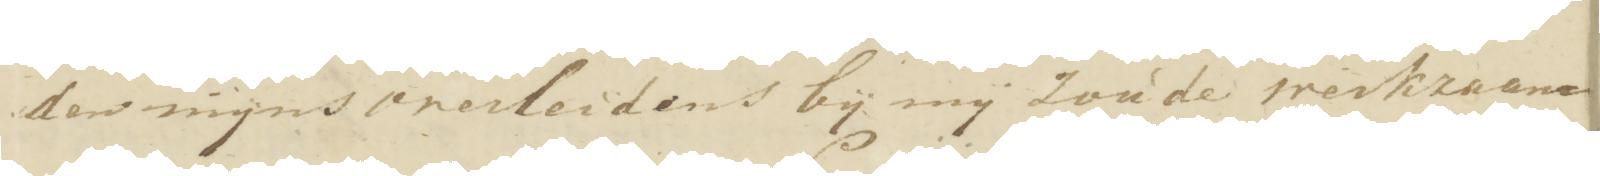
„den mijns overleidens bij mij zoude werkzaam
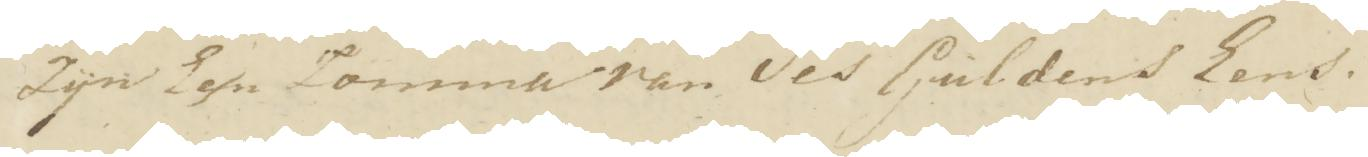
zijn Een zomma van Ses Guldens Eens.
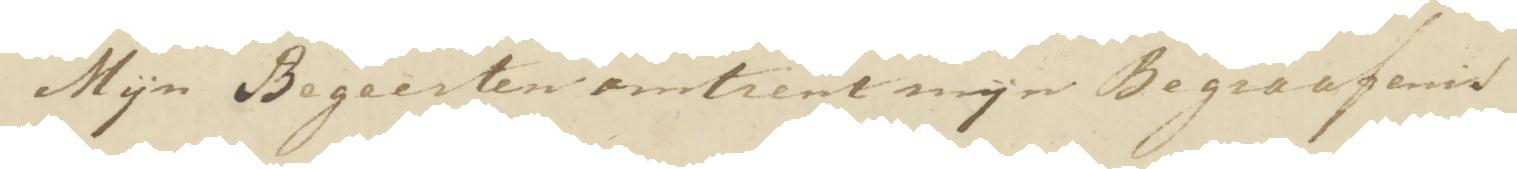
Mijn Begeerten omtrent mijn Begraafenis
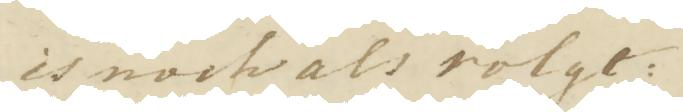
is noch als volgt:
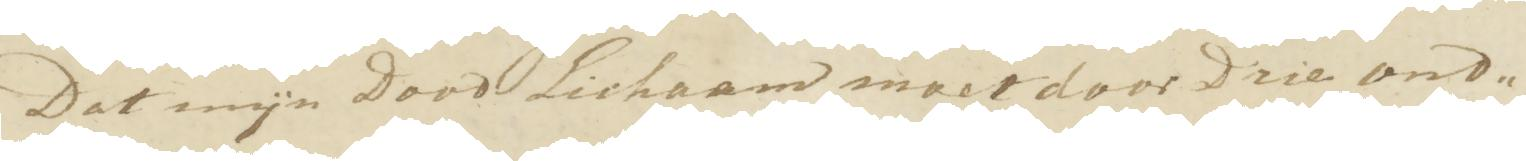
Dat mijn Dood Lichaam moet door Drie ond„
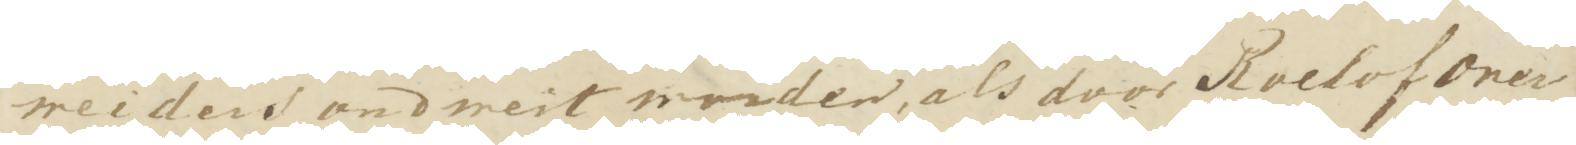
weiders ondweit worden, als door Roelof Over
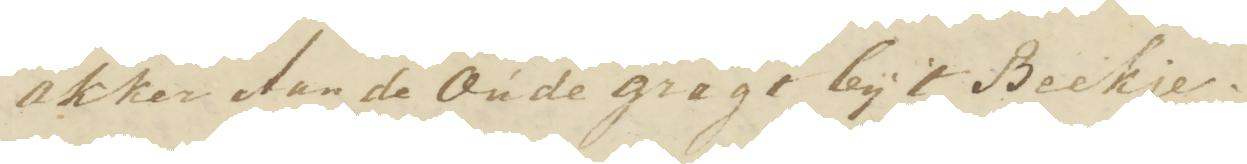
akker Aan de oude gragt bij ’t Beekje.
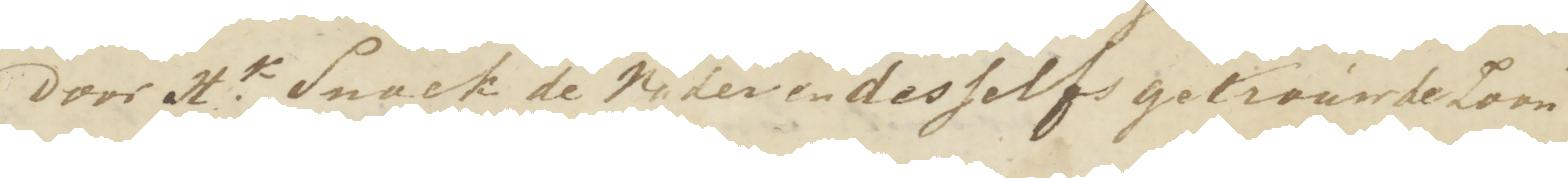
door H:k Snoek de Vader en desselfs getrouwde zoon
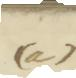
(a)
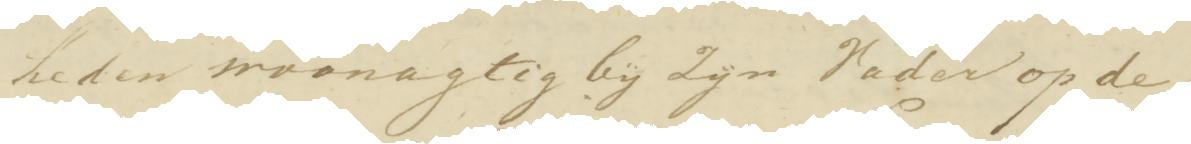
heden woonagtig bij zijn Vader op de
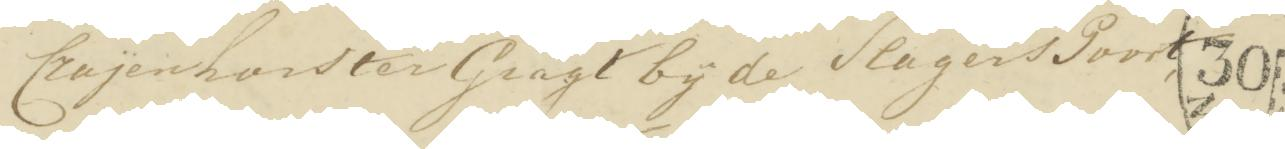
Crajenhorster Gragt bij de slagers Poort,
